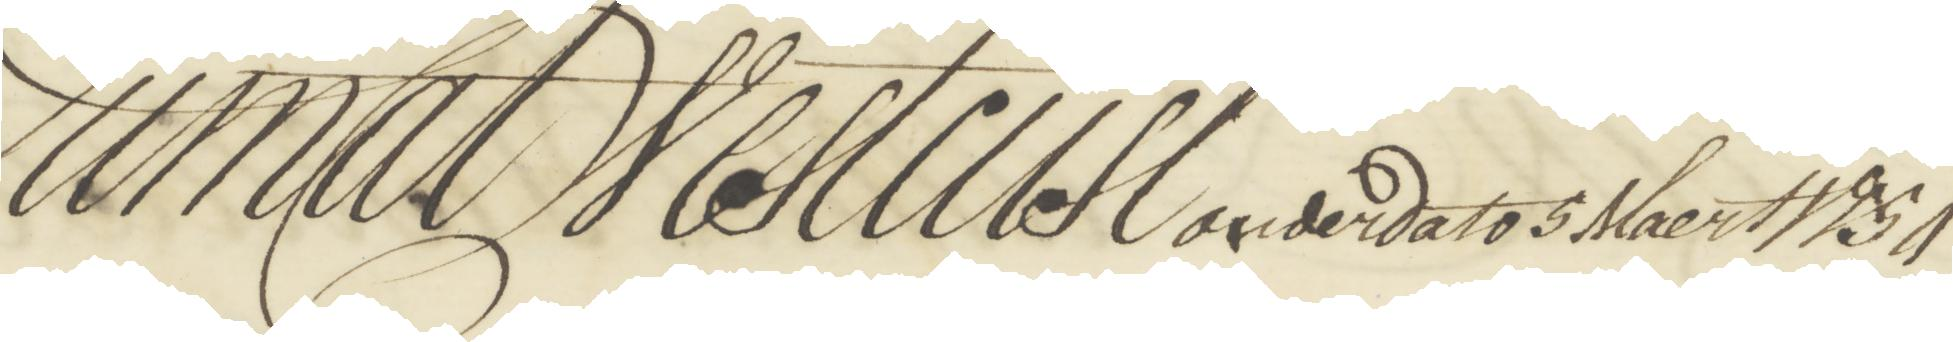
Van Sumats Westcust onderdato 5 Maert 1754
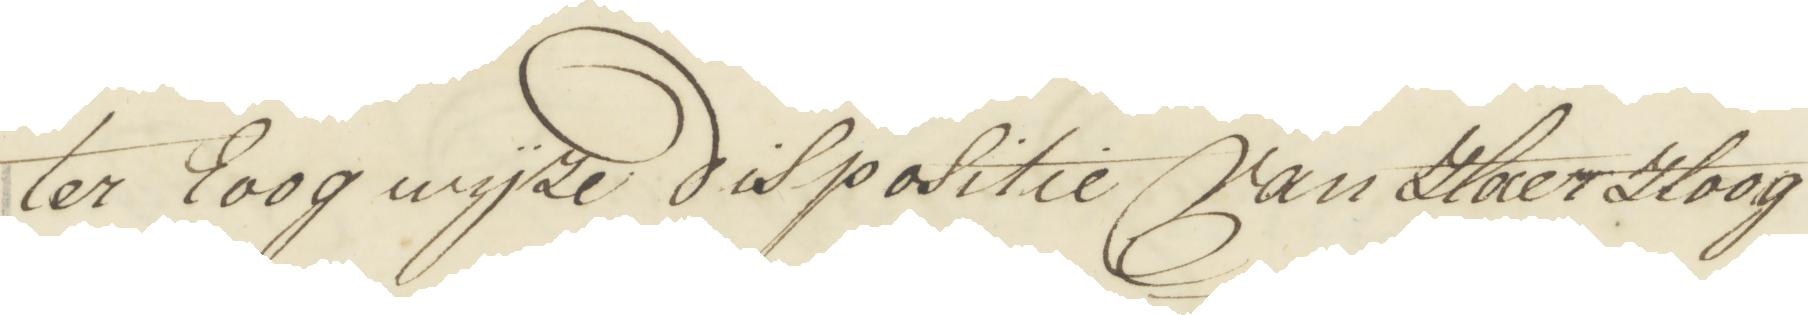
ter hoog wijze dispositie van Haer Hoog
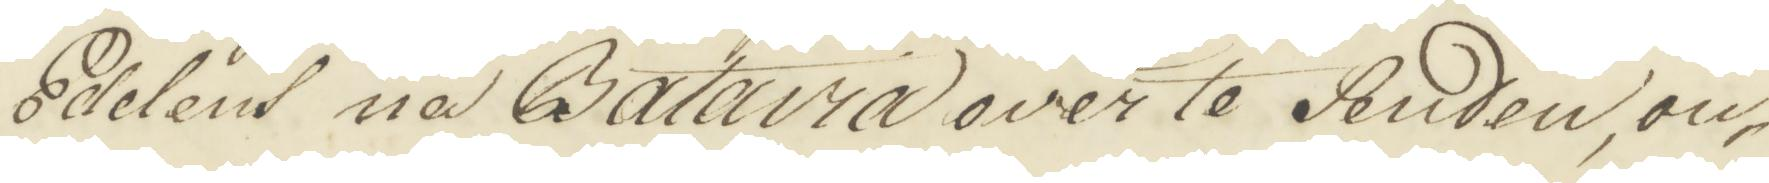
Edelens na Batavia over te senden, on
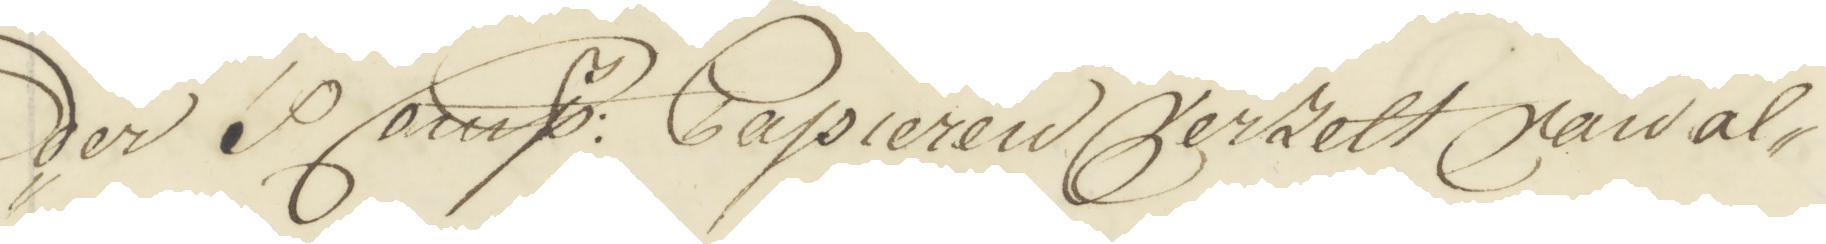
„der 's Comp:s Papieren verzelt van al„
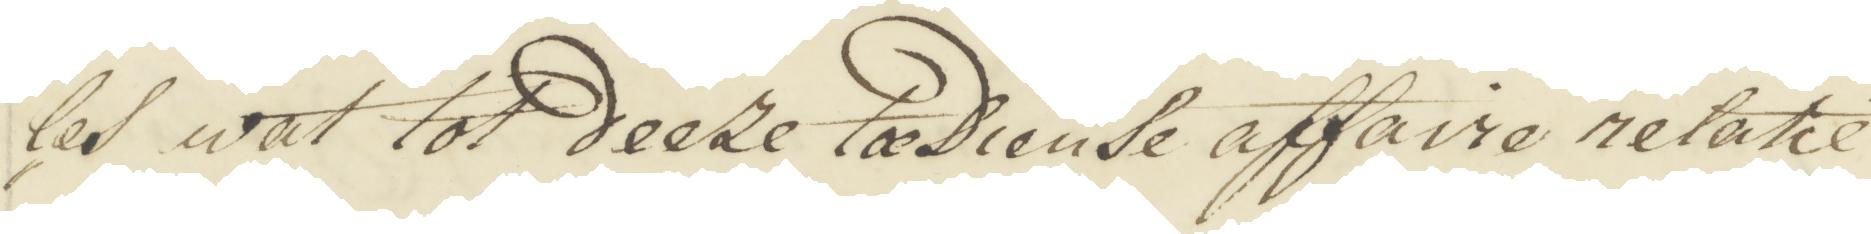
„les wat tot deeze taedieuse affaire relatie
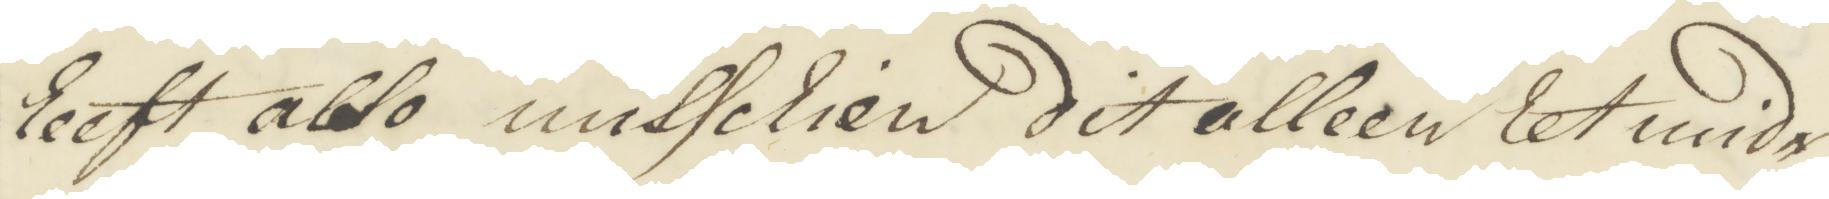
heeft, also misschien dit alleen het mid
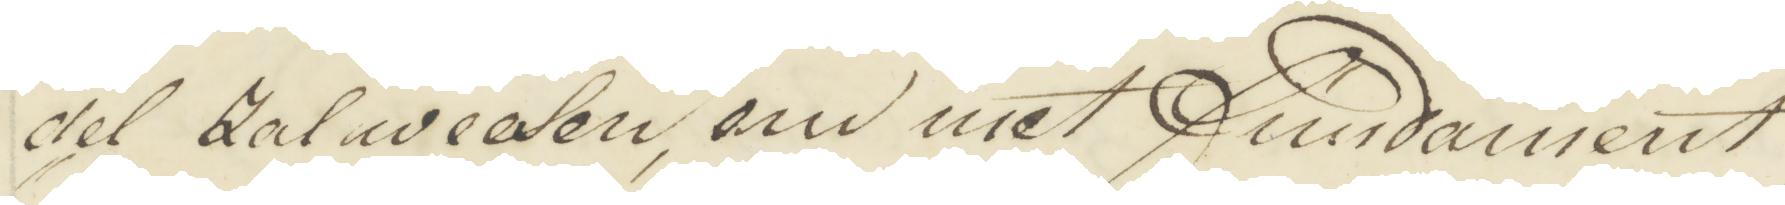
„del zal weesen, om met fundament
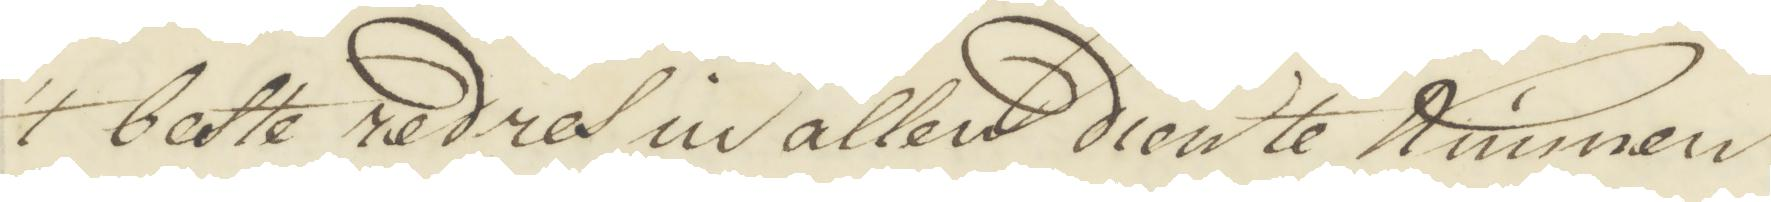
’t beste redres in allen dien te kunnen
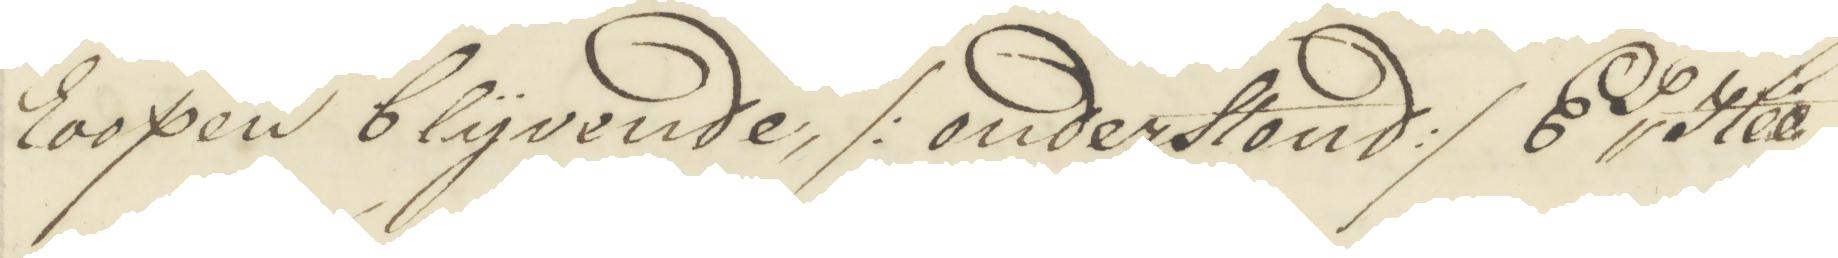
hoopen blijvende, /: onderstond :/ E„s Hee
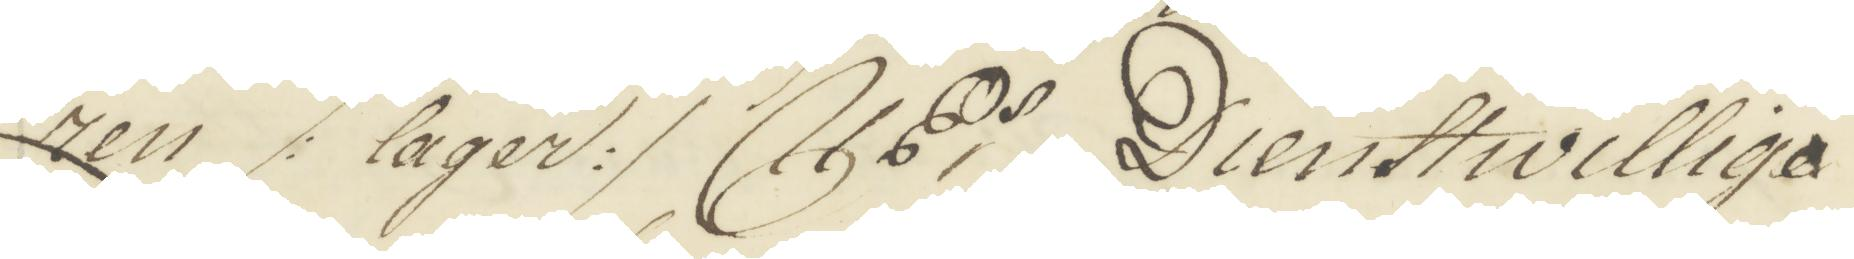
ren, /: lager :/ UE„s Dienstwillige
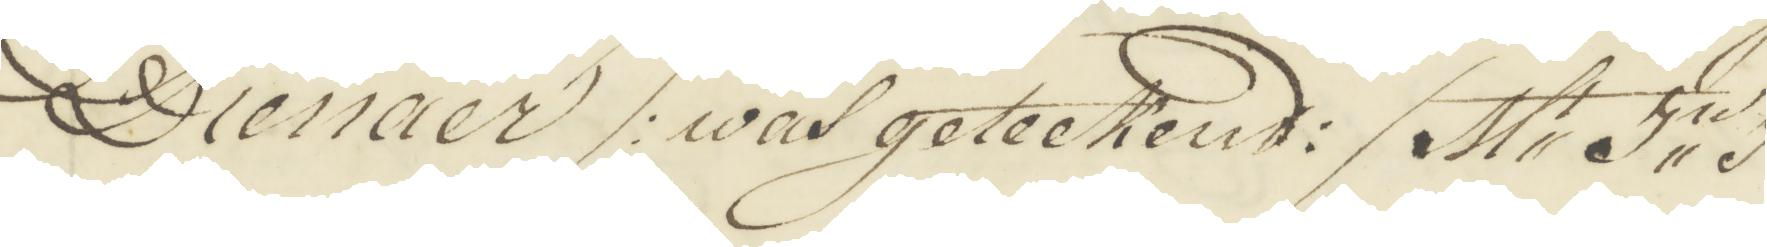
Dienaer /: was geteekend :/ M„t J„n J„sz
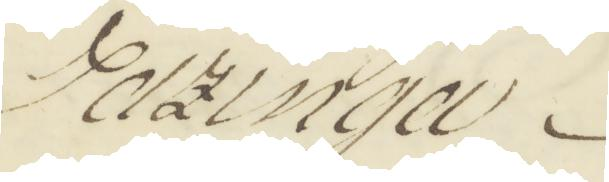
Jazinga
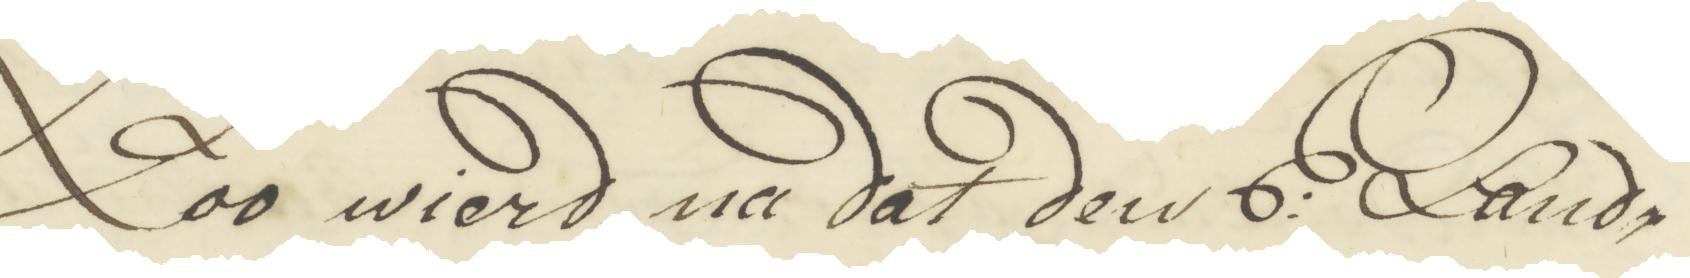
Zoo wierd, na dat den E: Land
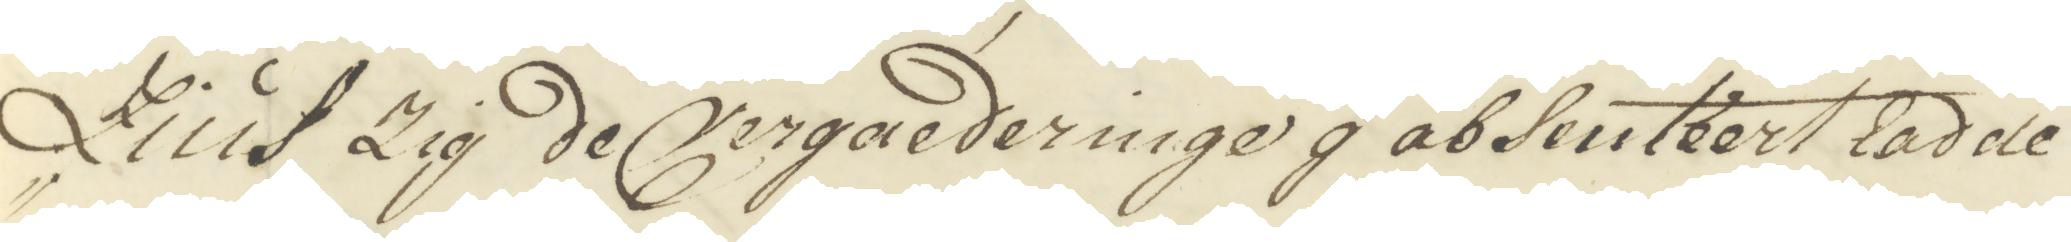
„zius zig de vergaederinge g'absenteert hadde
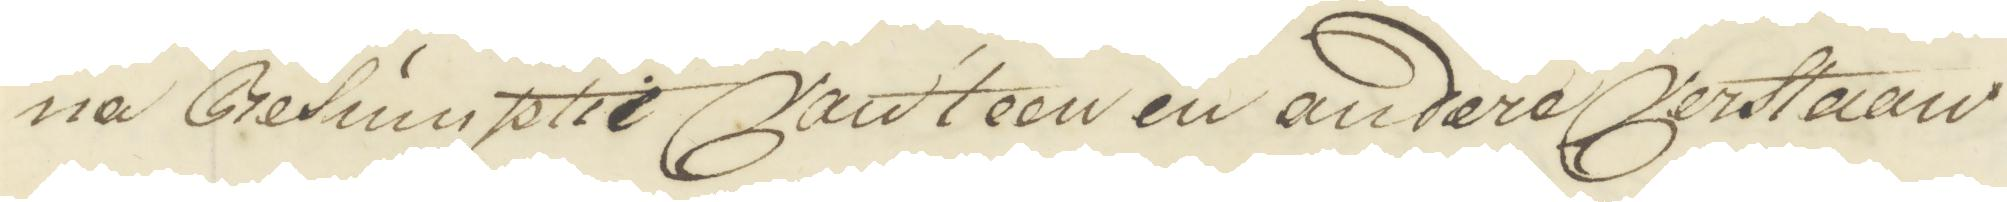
na Resumptie van 't een en andere verstaan
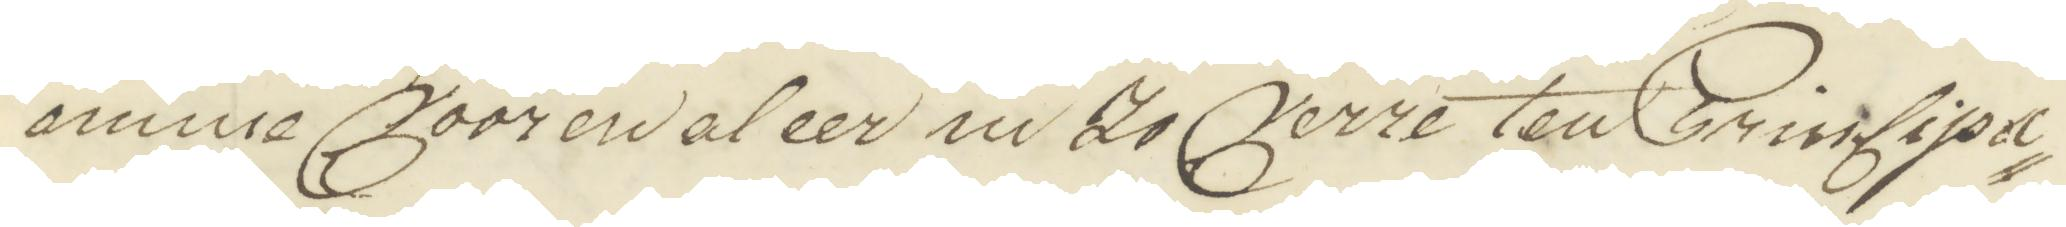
omme voor en al eer in zo verre ten Principa„
